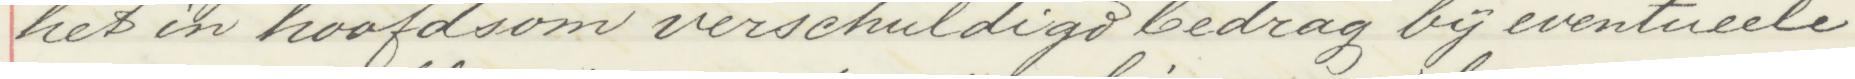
het in hoofdsom verschuldigd bedrag bij eventueele
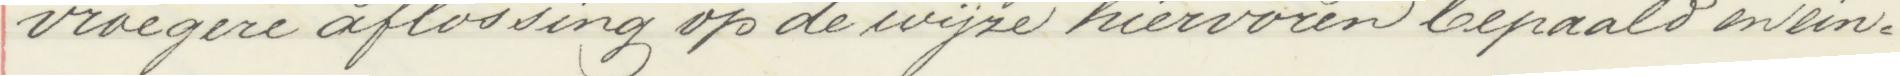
vroegere aflossing op de wijze hiervoren bepaald en ein=
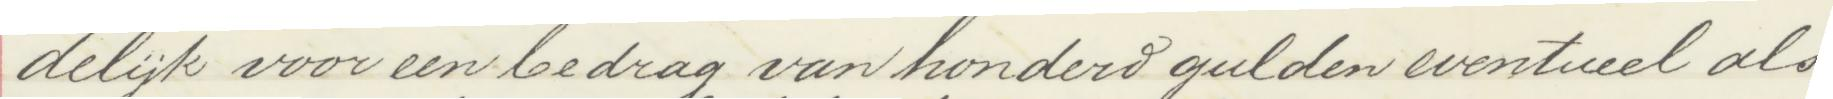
delijk voor een bedrag van honderd gulden eventueel als
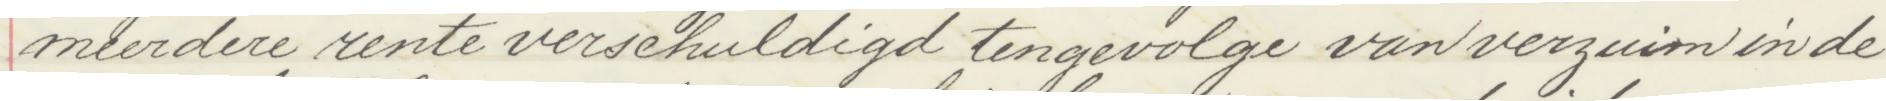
meerdere rente verschuldigd tengevolge van verzuim in de
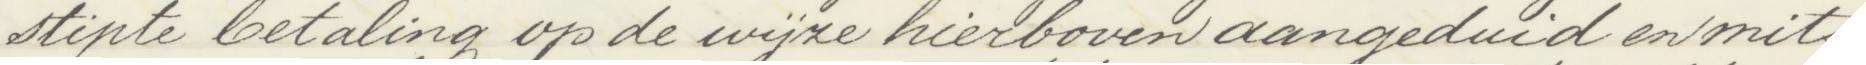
stipte betaling op de wijze hierboven aangeduid en mits=
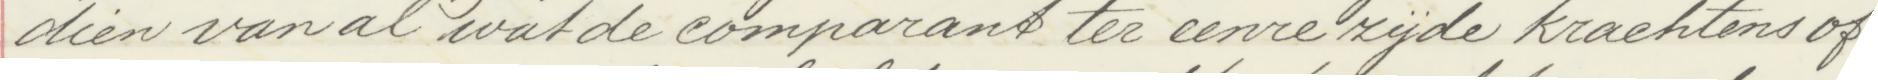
dien van al wat de comparant ter eenre zijde krachtens of
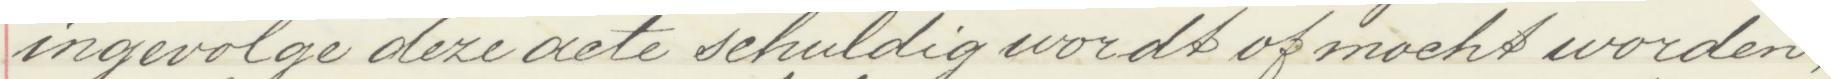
ingevolge deze acte schuldig wordt of mocht worden,
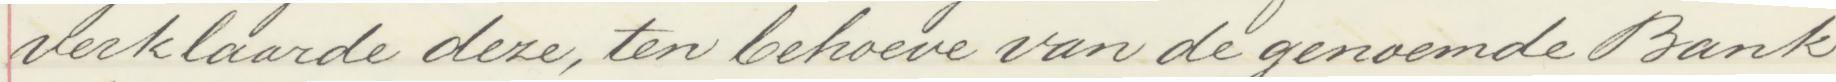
verklaarde deze, ten behoeve van de genoemde Bank
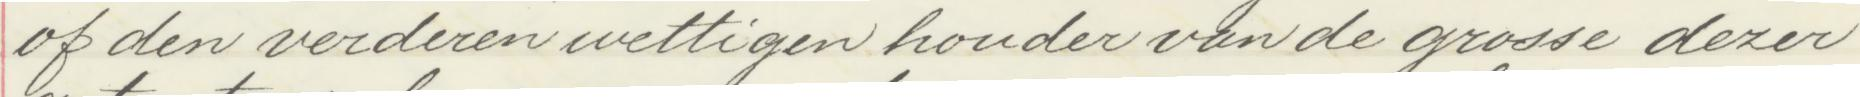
of den verderen wettigen houder van de grosse dezer
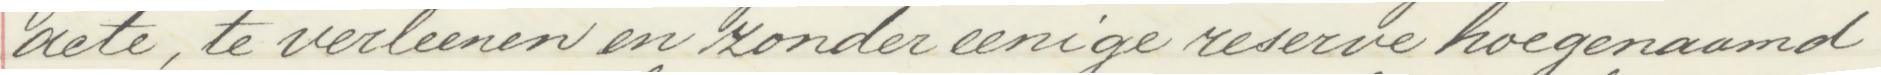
acte, te verleenen en zonder eenige reserve hoegenaamd
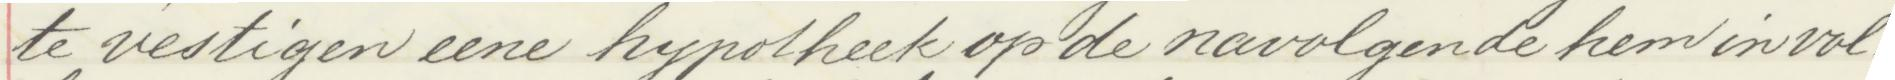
te vestigen eene hypotheek op de navolgende hem in vol
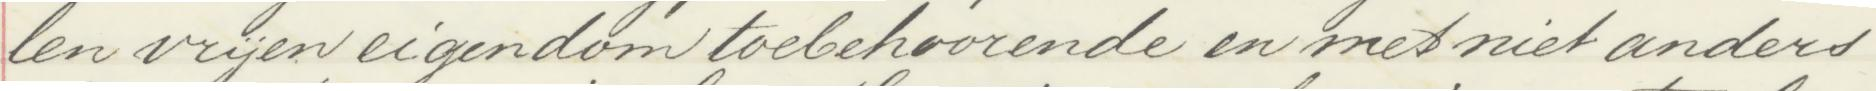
len vrijen eigendom toebehoorende en met niet anders
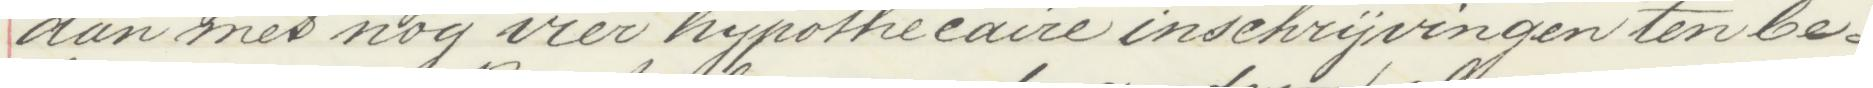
dan met nog vier hypothecaire inschrijvingen ten be=
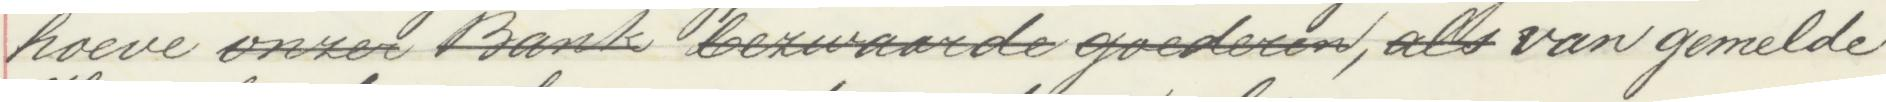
hoeve onzer Bank bezwaarde goederen, als van gemelde
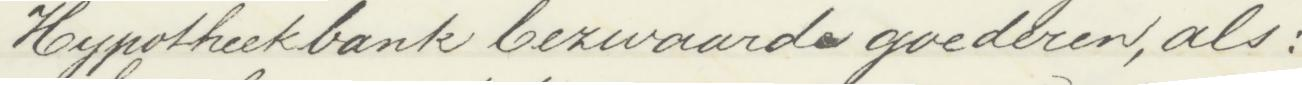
Hypotheekbank bezwaarde goederen, als:
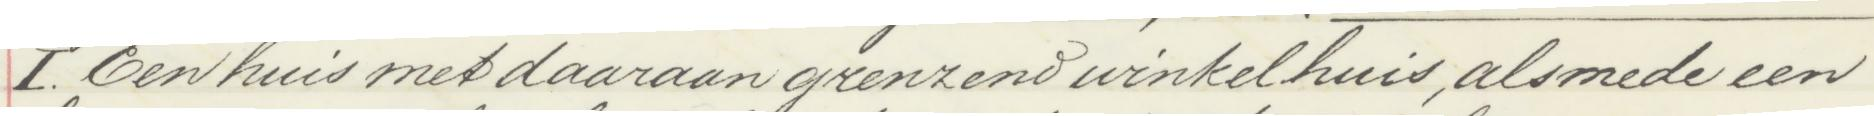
I. Een huis met daaraan grenzend winkelhuis, alsmede een
